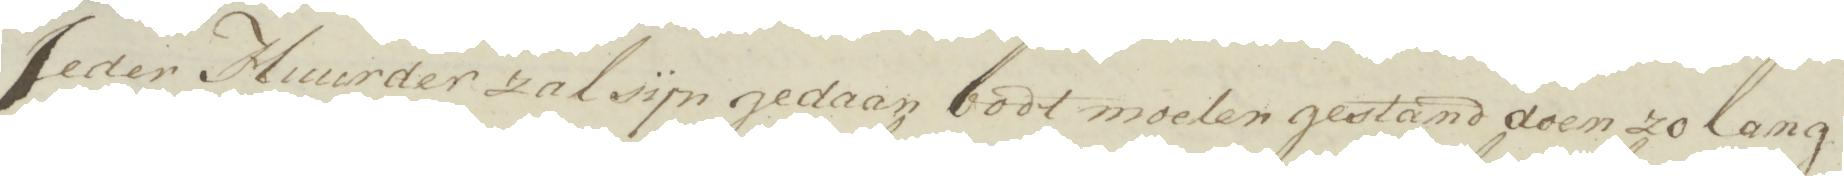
Jeder Huurder zal sijn gedaan bodt moeten gestand doen zo lang
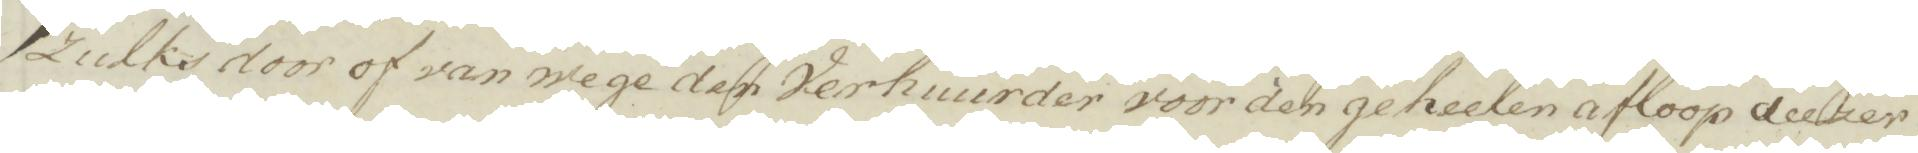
zulks door of van wege der Verhuurder voor den geheelen afloop deezer
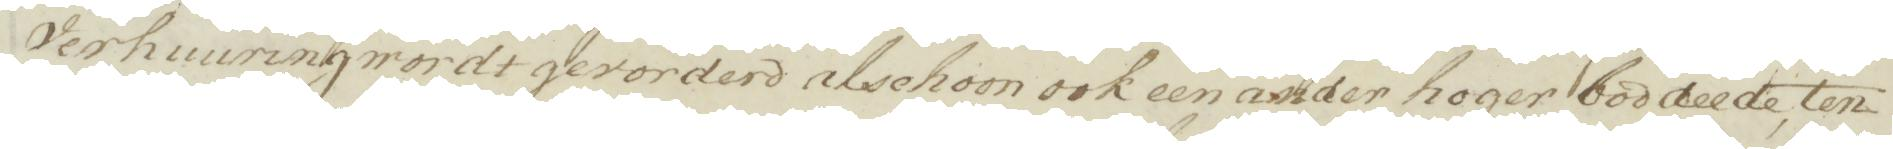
Verhuuring wordt gevorderd alschoon ook een ander hoger bod deede, ten
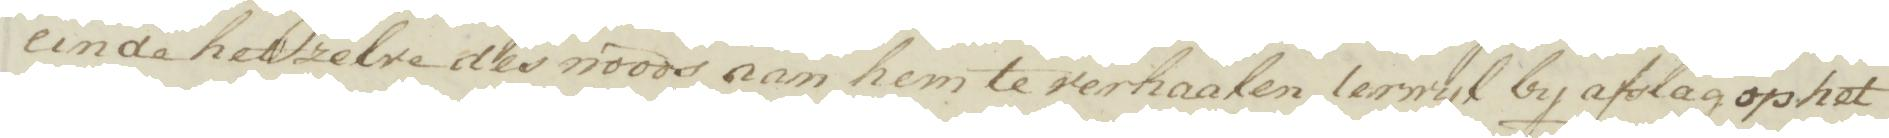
einde hetzelve des noods aan hem te verhaalen, terwyl by afslag op het
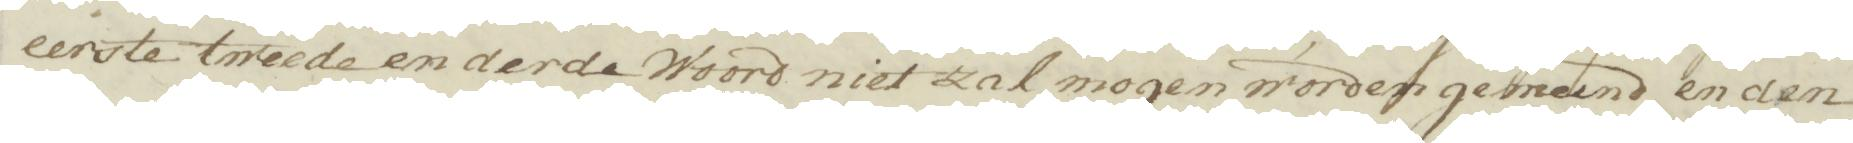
eerste tweede en derde woord niet zal mogen worden gemeend, en den
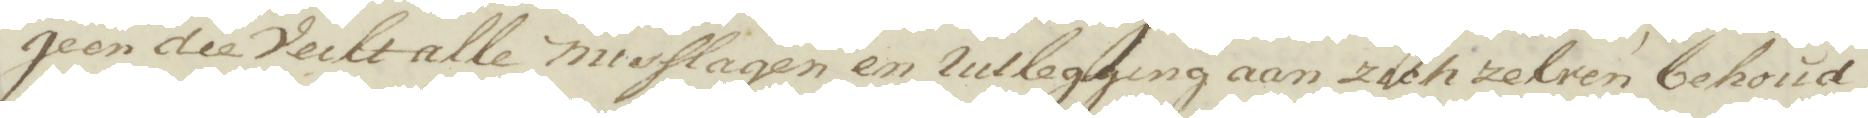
geen die Veilt alle misslagen en uitlegging aan zich zelven behoud
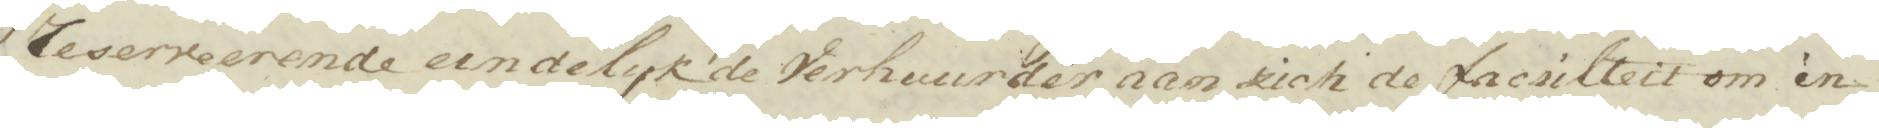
reserveerende eindelyk de verhuurder aan zich de faculteit om in
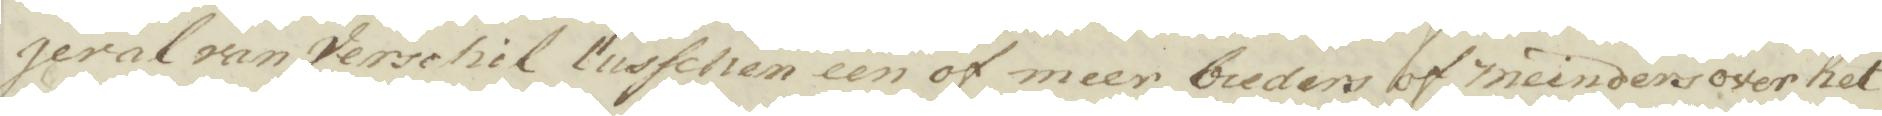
geval van Verschil tusschen een of meer bieders of meinders over het
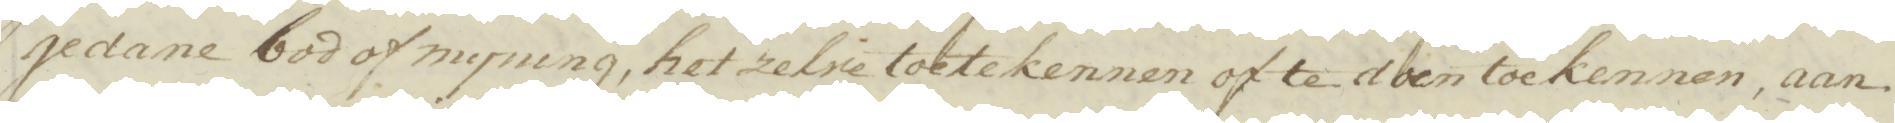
gedane bod of myning, het zelve toe te kennen of te doen toekennen, aan
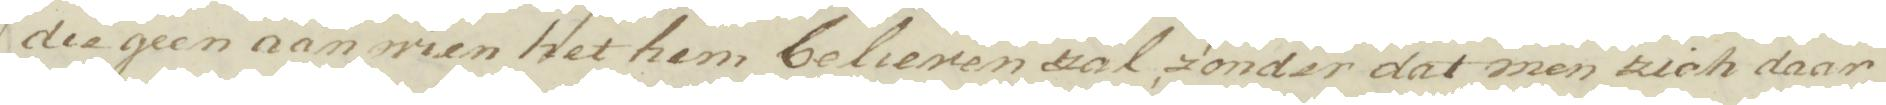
die geen aan wien het hem believen zal zonder dat men zich daar
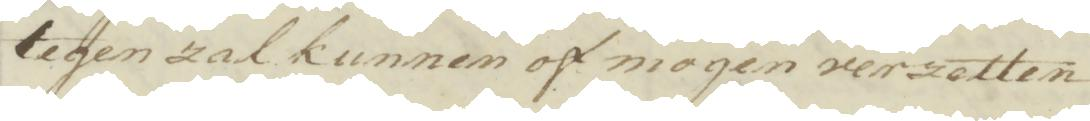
tegen zal kunnen of mogen verzetten
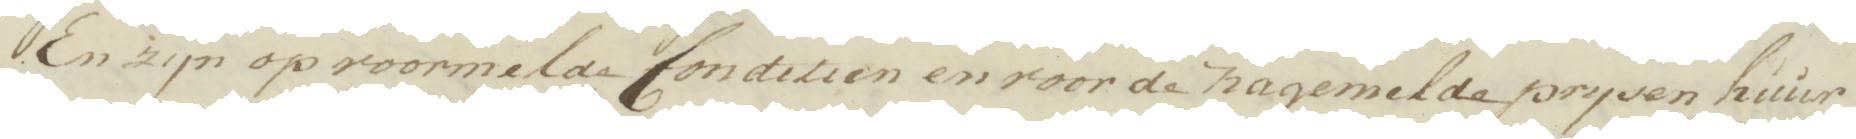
En zyn op voormelde Conditien en voor de nagemelde prysen huur
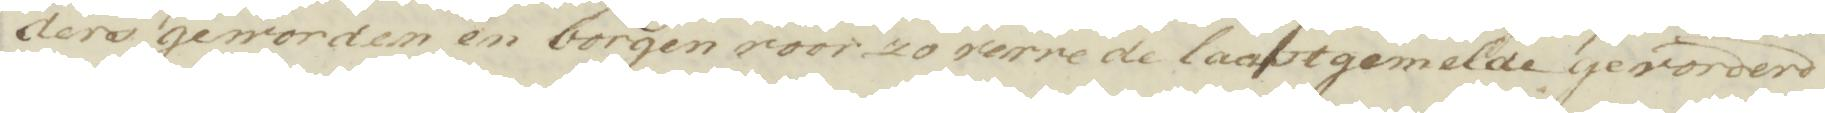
ders geworden en borgen voor zo verre de laastgemelde gevorderd
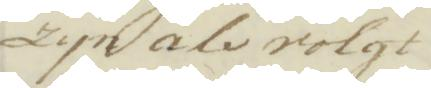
zyn als volgt
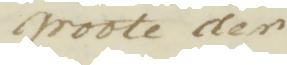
groote der
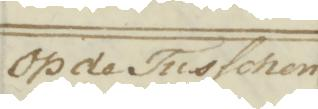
Op de Tusschen
